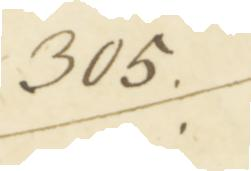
305./.
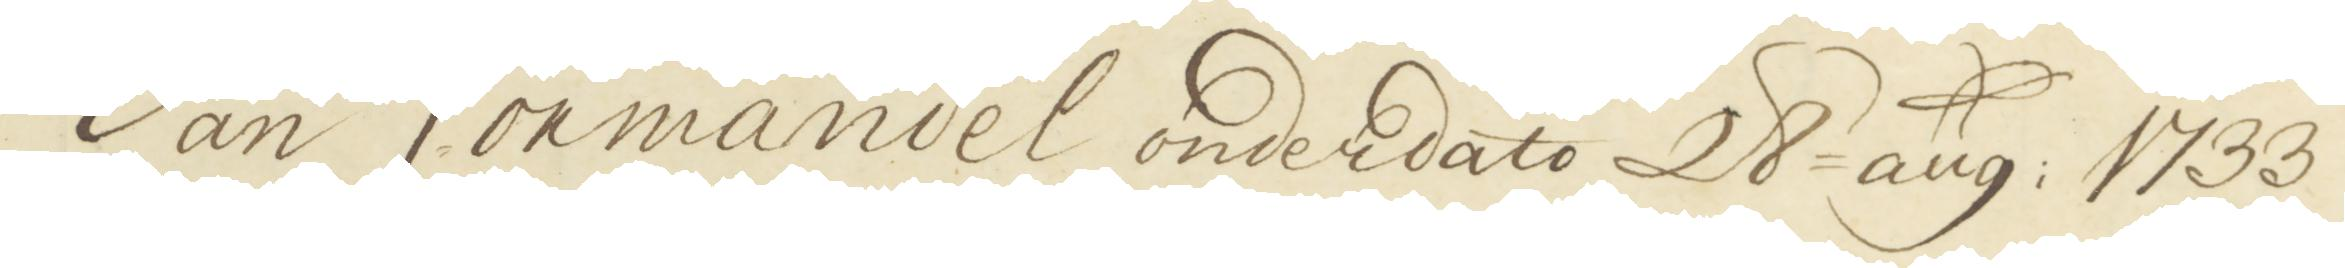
Van Cormandel onderdato 28=' aug: 1733
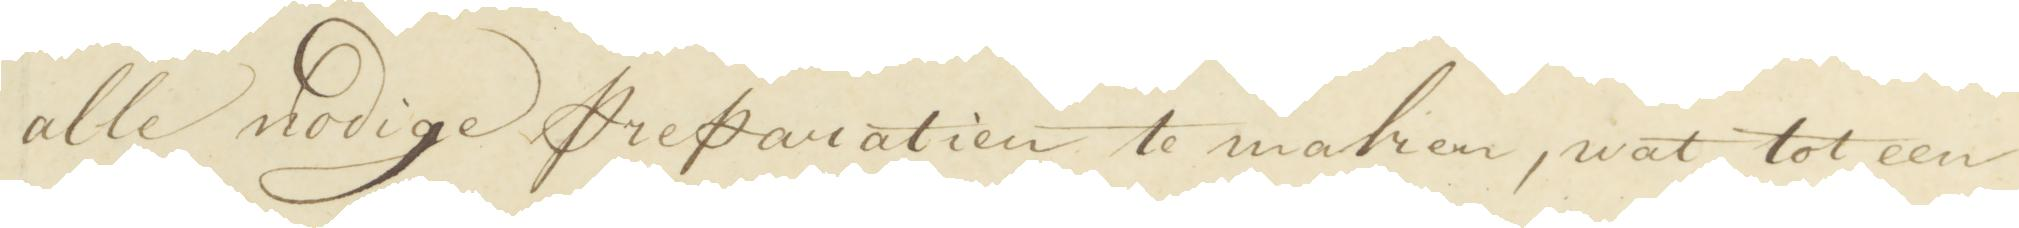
alle nodige preparatien te maken, wat tot een
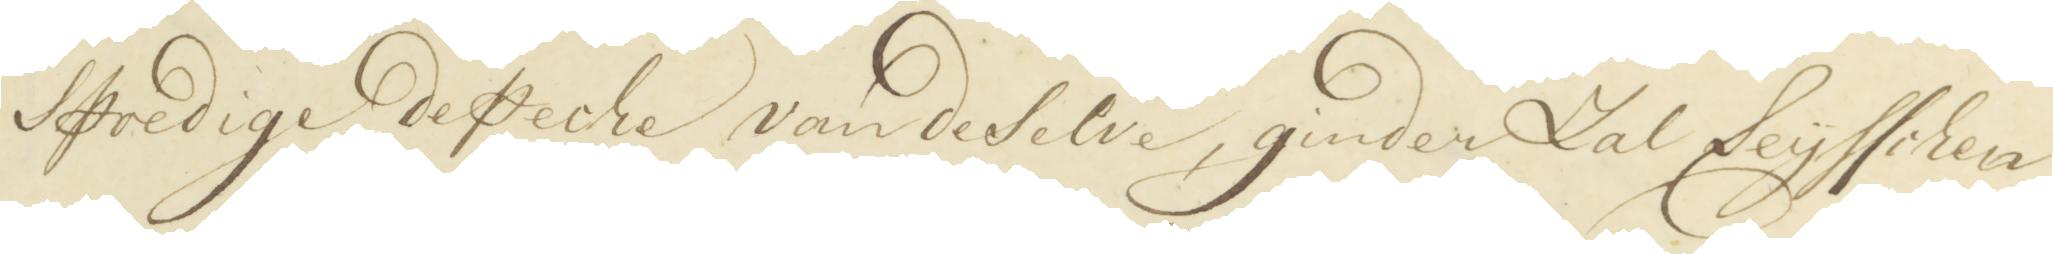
spoedige depeche van deselve, ginder zal vereijsschen
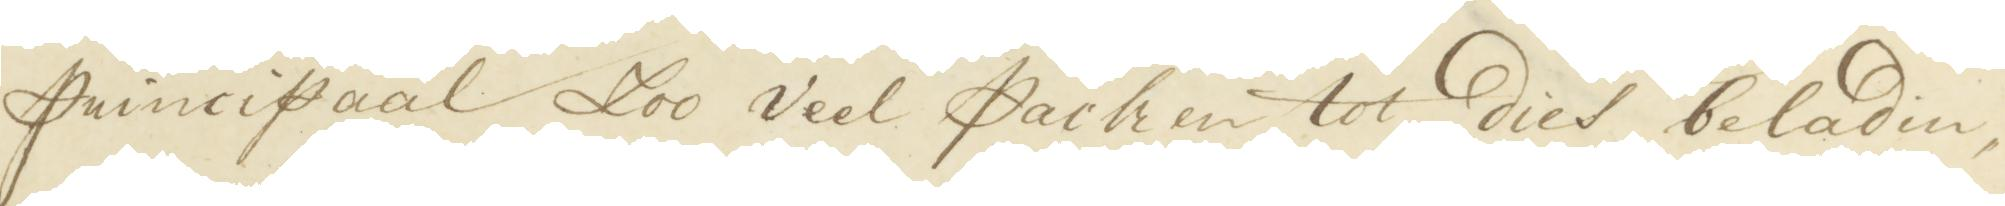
principaal zoo veel packen tot dies beladin,
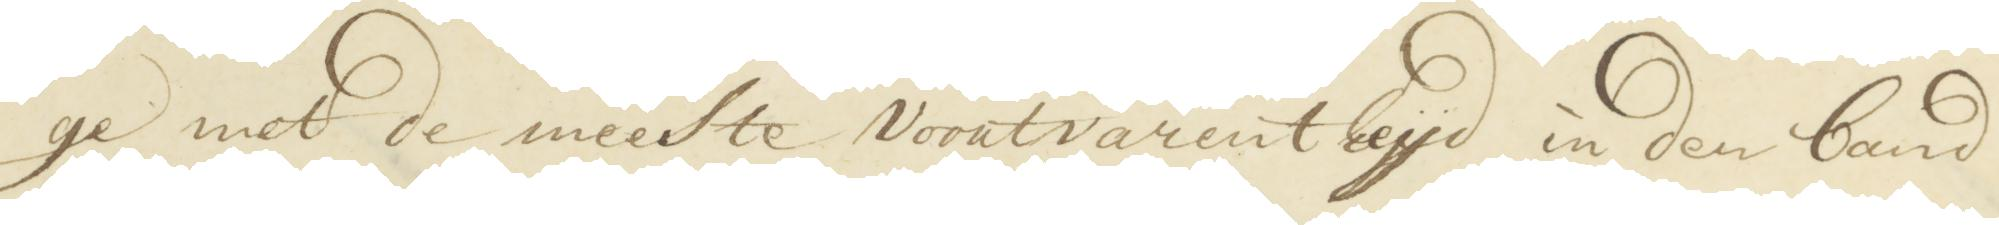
ge met de meeste voortvarentheijd in den band
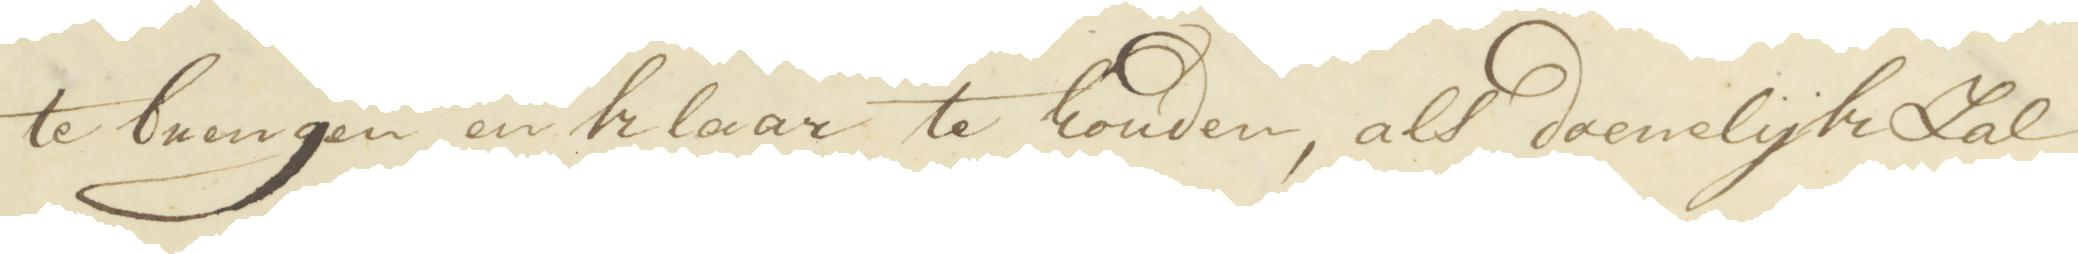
te brengen en klaar te houden, als doenelijk zal
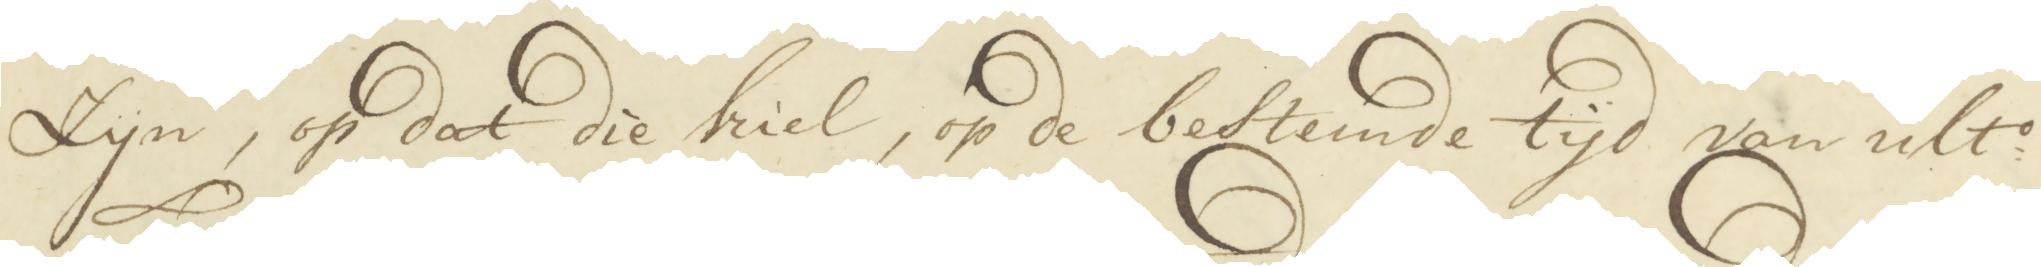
zijn, op dat die kiel, op de bestemde tijd van ult=o
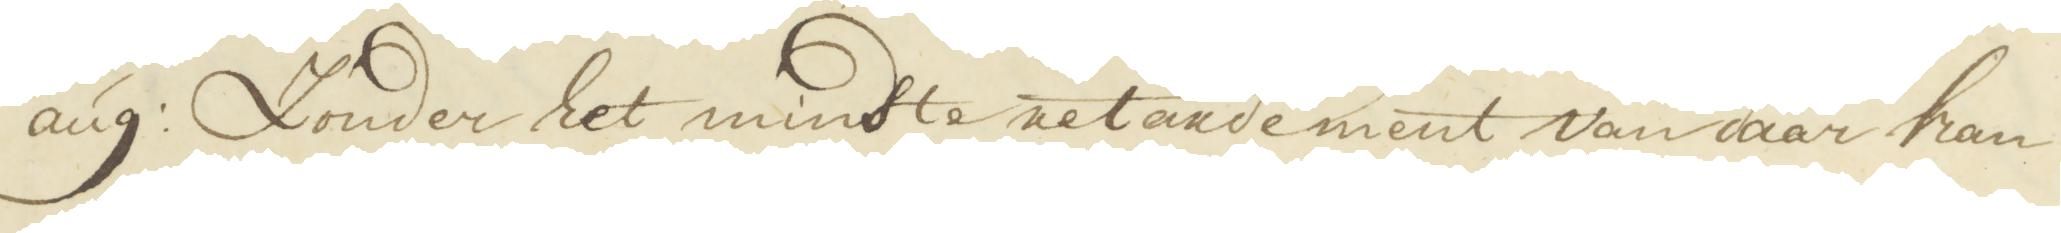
aug: zonder het minste retardement van daar kan
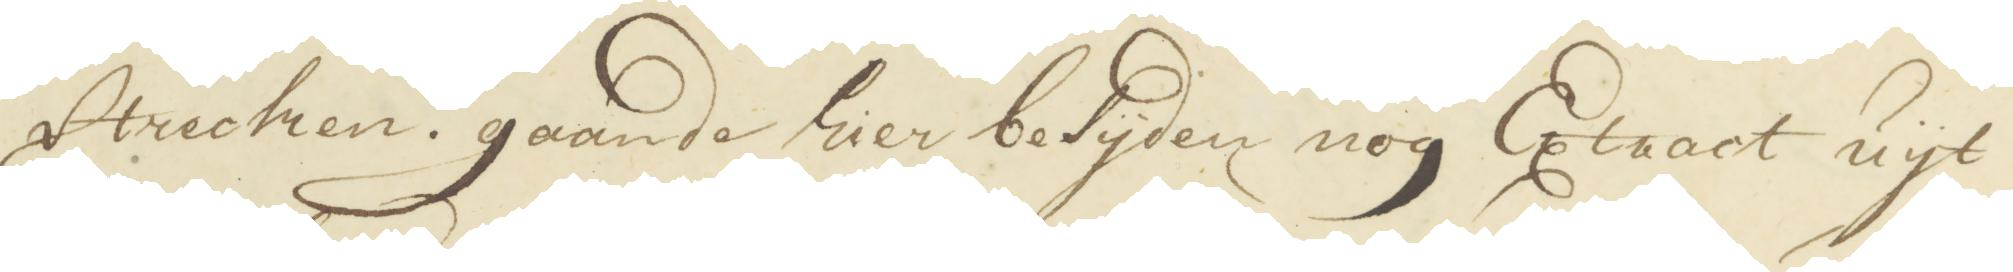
vertrecken. gaande hier besijden nog Extract uijt
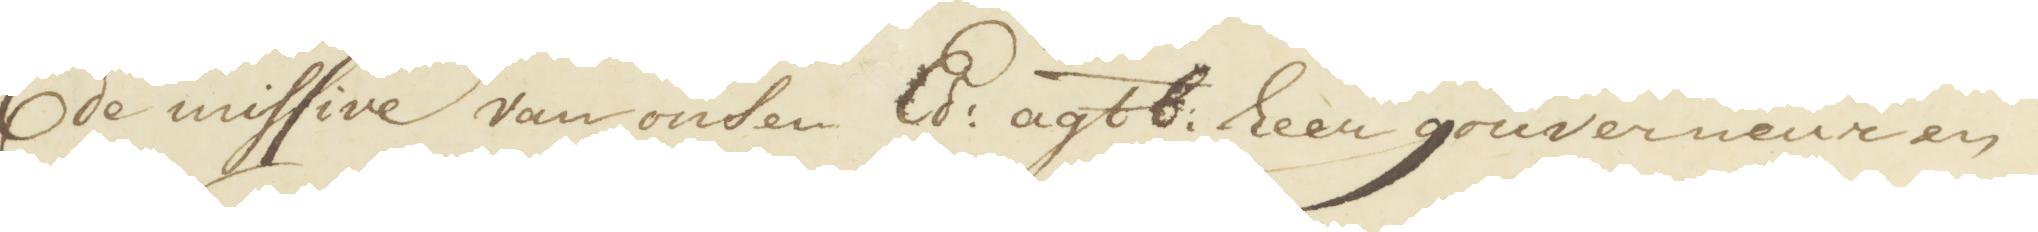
de missive van onsen Ed: agtb: heer gouverneur en
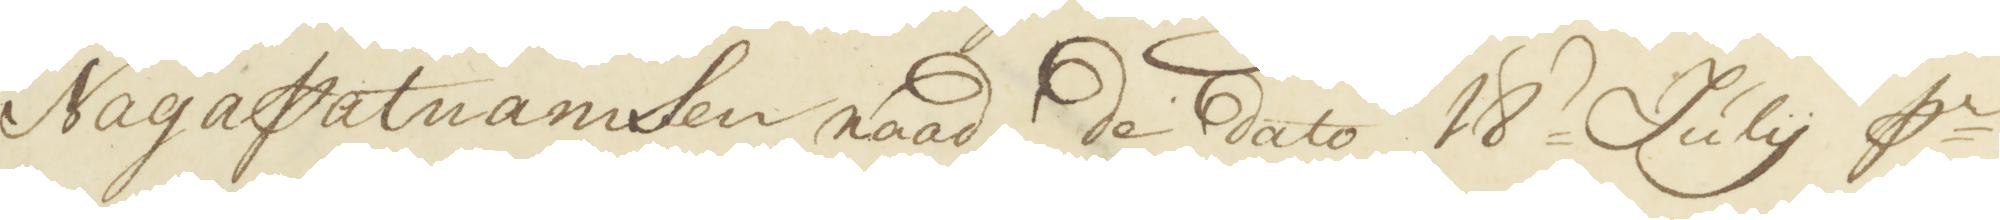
Nagapatnamsen raad, de dato 18=' Julij p=r
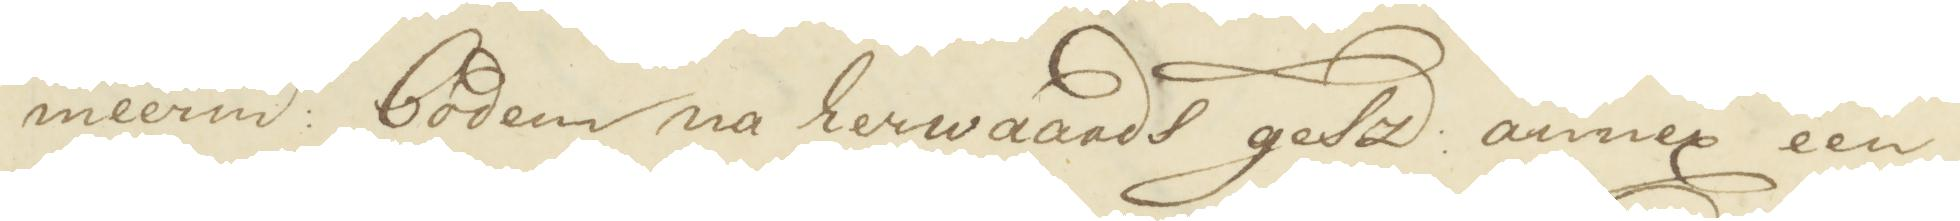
meerm: bodem na herwaards gesz: annex een
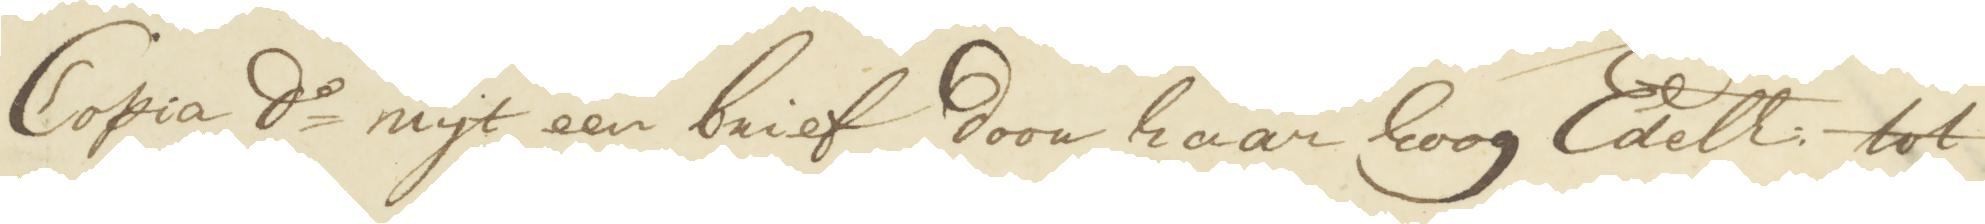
Copia d=o uijt een brief door haar hoog Edelh: tot
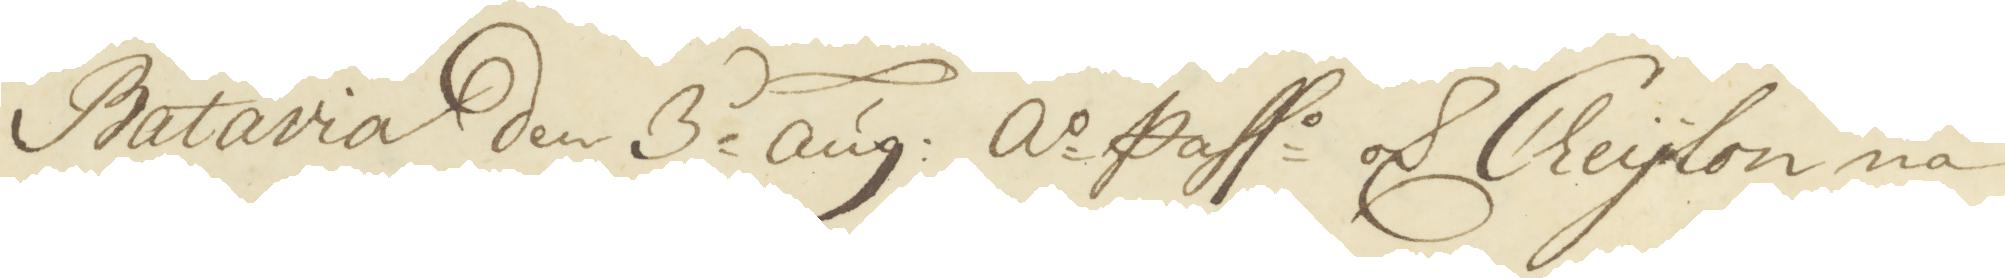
Batavia den 3=' aug: A:o pass=o over Cheijlon na
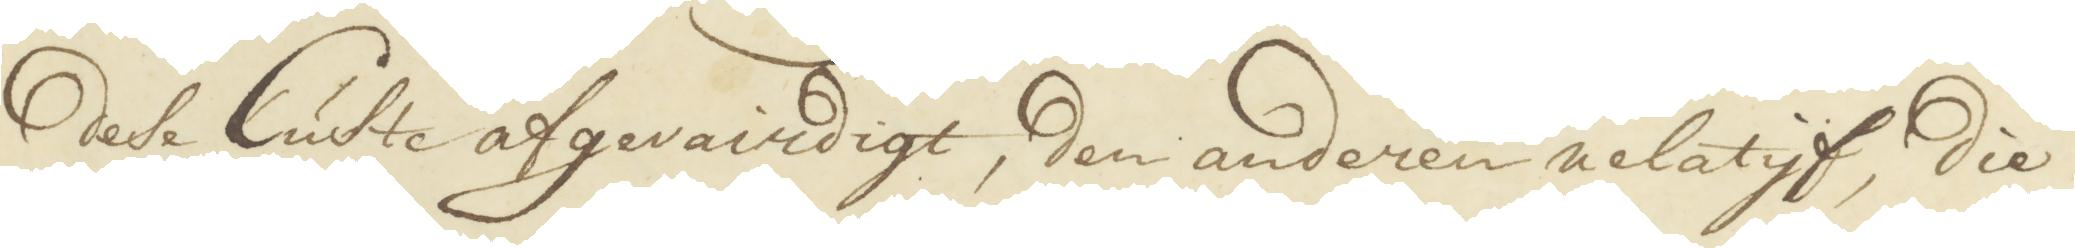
dese Custe afgevairdigt, den anderen relatijf, die
